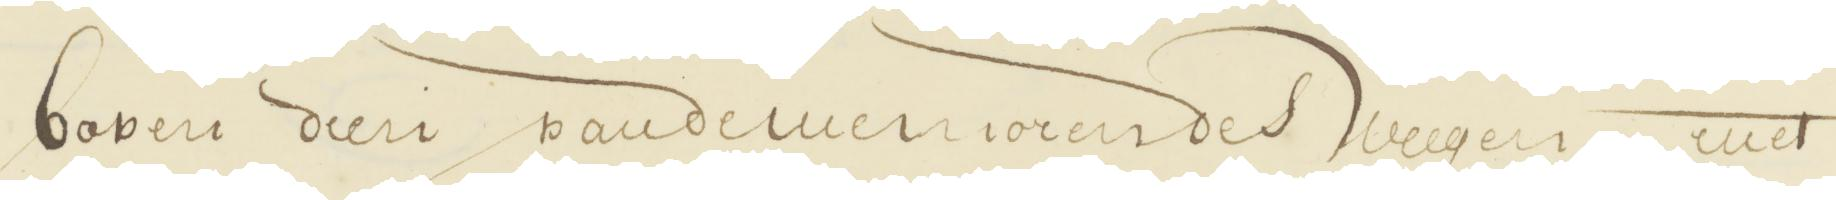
boven dien vandememoren des weegen met
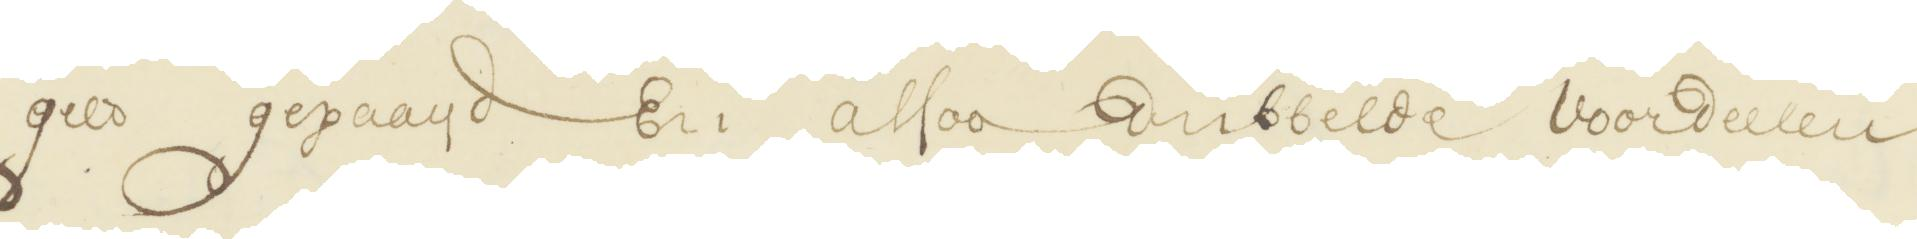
geld gepaayd En alsoo dubbelde voordeelen
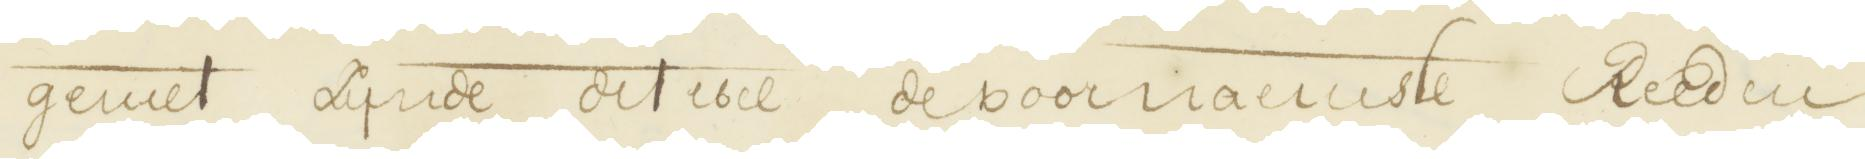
geniet zynde dit wel de voornaemste Reeden
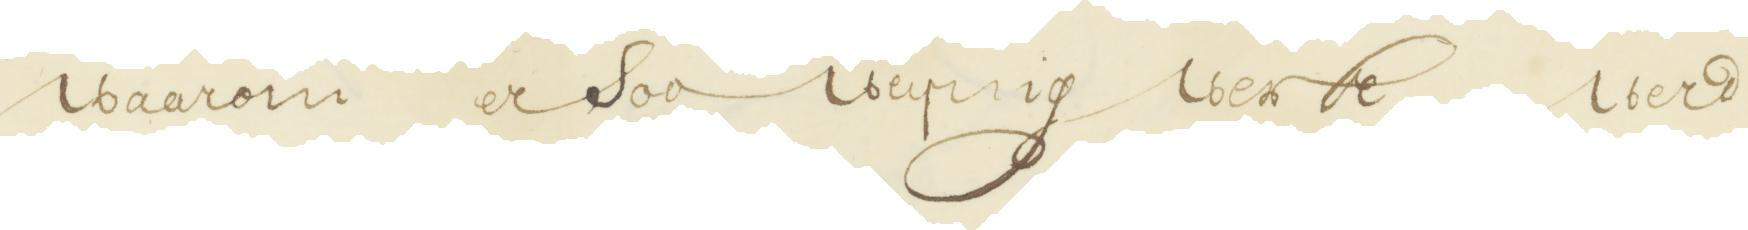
waarom er soo weynig werk werd
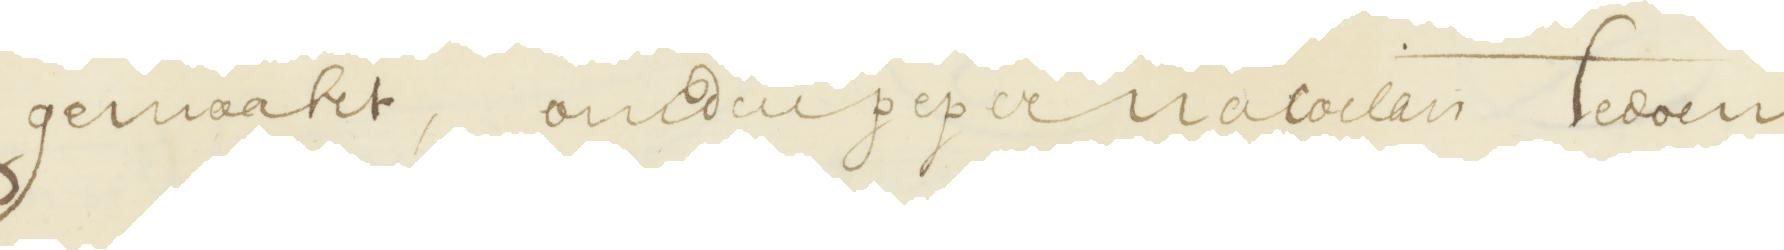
gemaakt, om den peper nacoilan tedoen
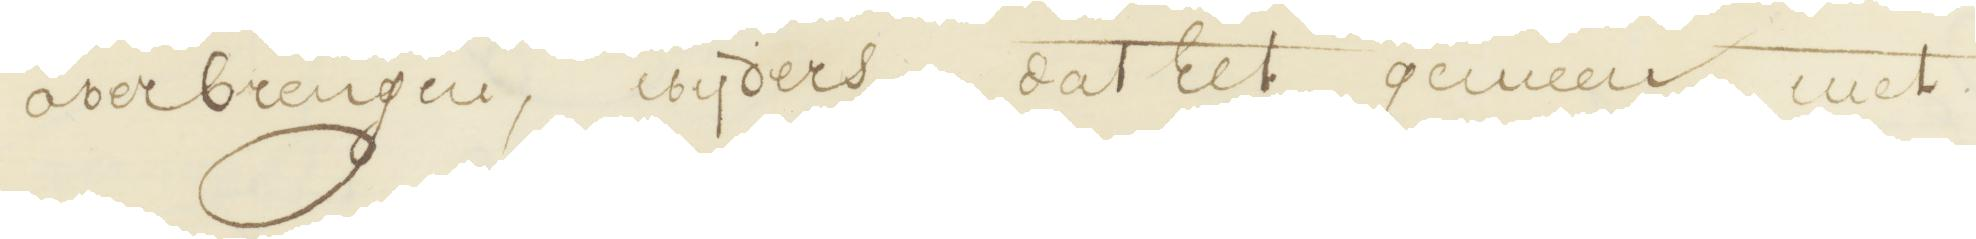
overbrengen, wijders, dat het gemeen met
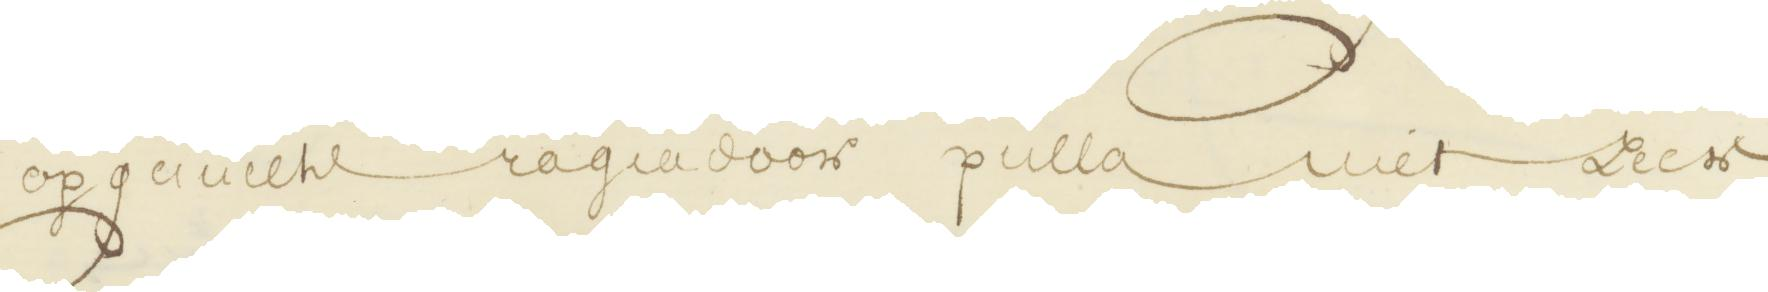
op gemelte ragiadoor pulla niet zeer
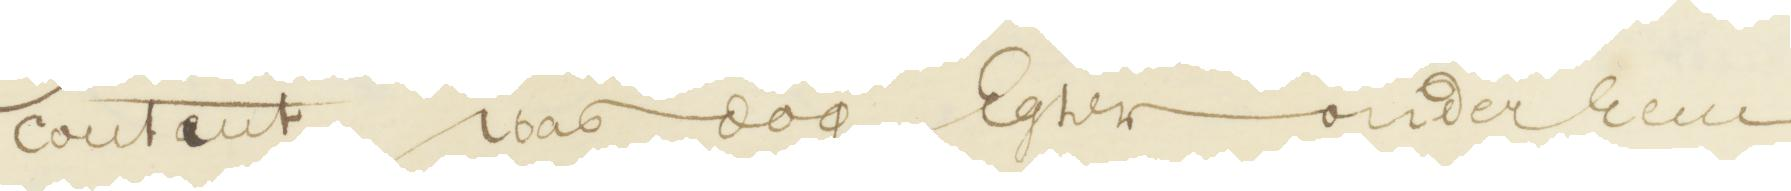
content was dog Egter onder hem
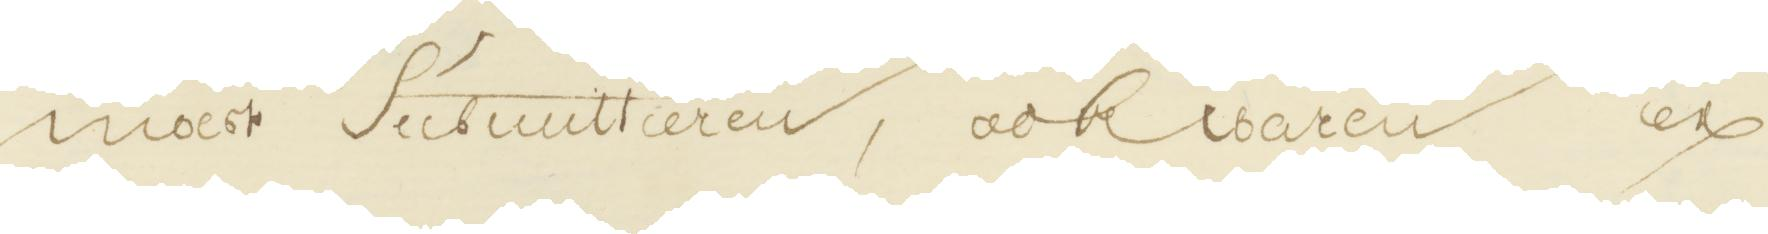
moest susmittieren, ook waren er
